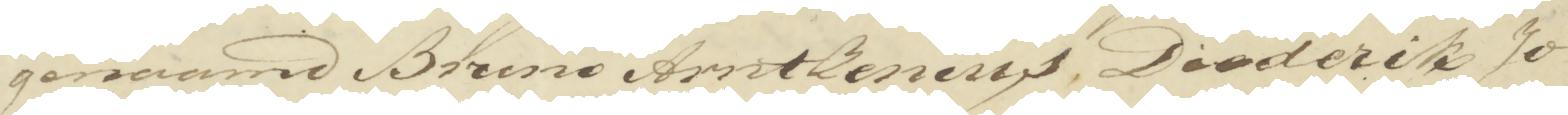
genaamd Bruno Arntzenius, Diederik Jo
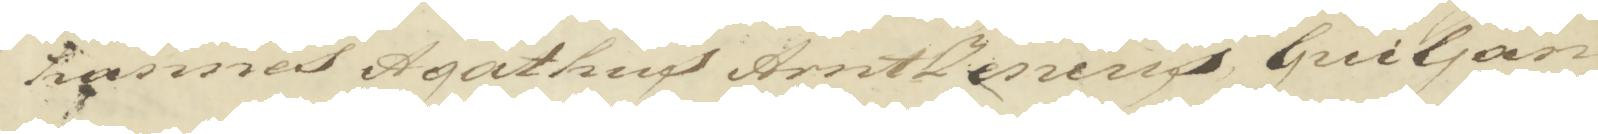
hannes Agathus Arntzenius, Guiljan
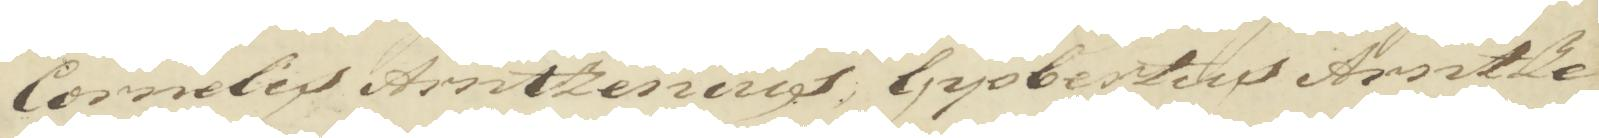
Cornelis Arntzenius, Gysbertus Arntze
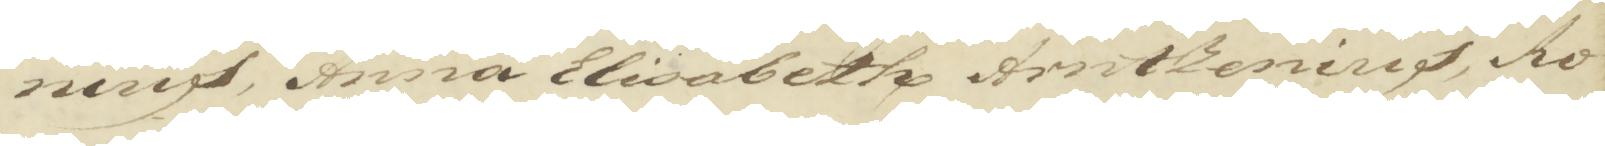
nius, Anna Elisabeth Arntzenius, Ro
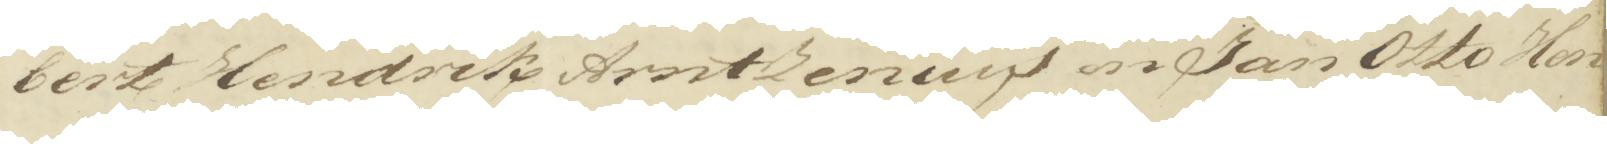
bert Hendrik Arntzenius en Jan Otto Hen
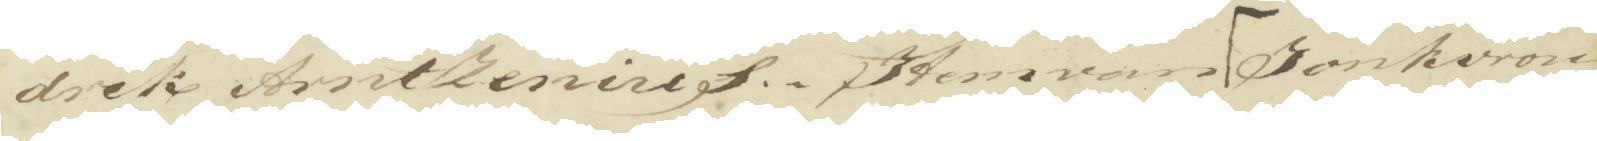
drek Arntzenius. Item van ¶ Jonkvrou
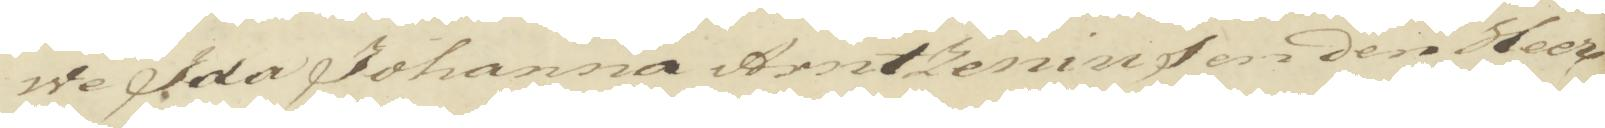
we Ida Johanna Arntzenius en den Heer
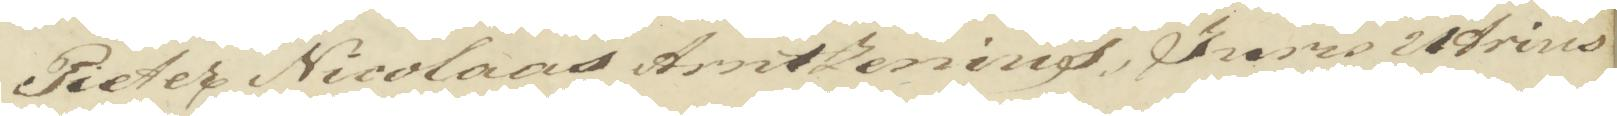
Pieter Nicolaas Arntzenius, Freris Utrius
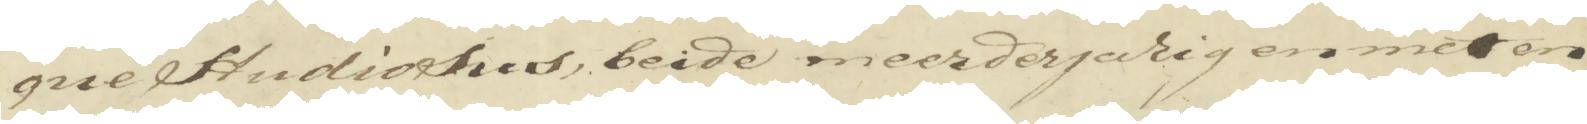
que Studiosius, beide meerderjarig en met en
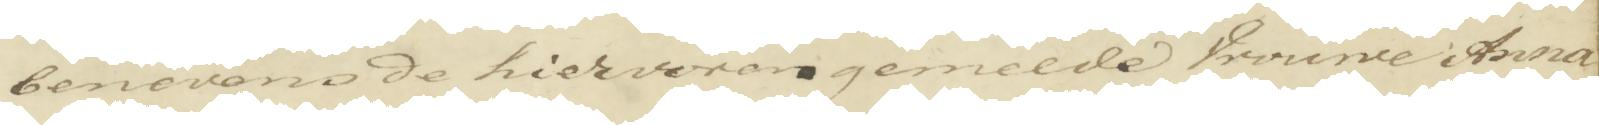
benevens de hiervoren gemelde Vrouwe Anna
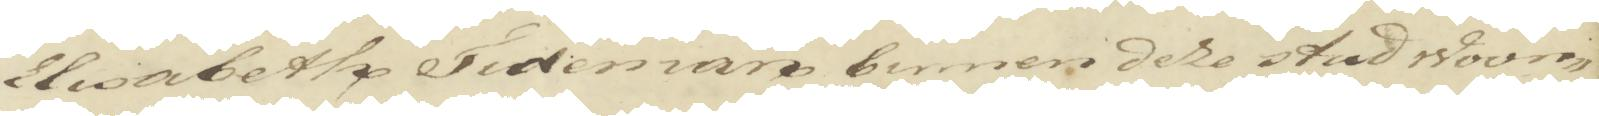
Elisabeth Tideman binnen deze stad woon„
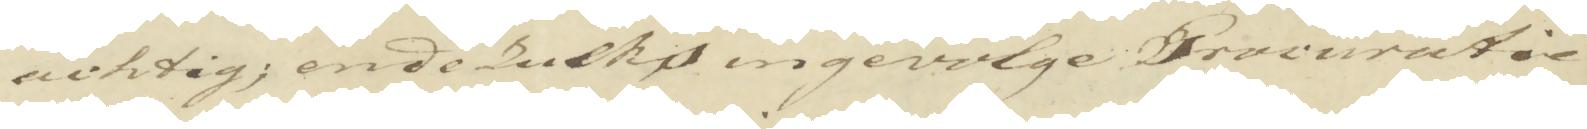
achtig, en de zulks ingevolge Procuratie.
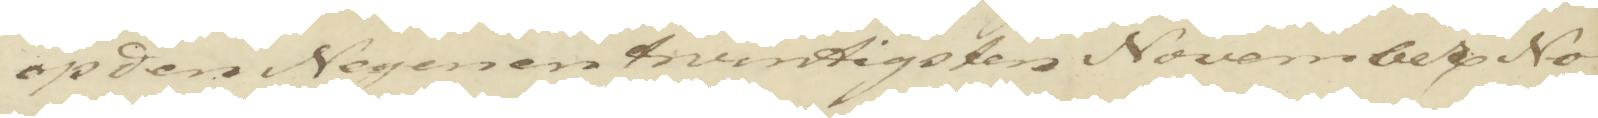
op den Negen en twintigsten November No
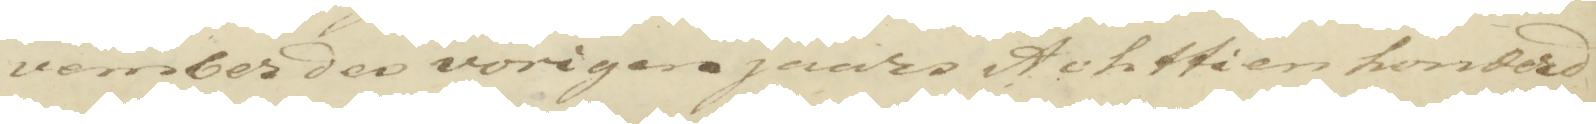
vember des vorigen jaars Achttien honderd
